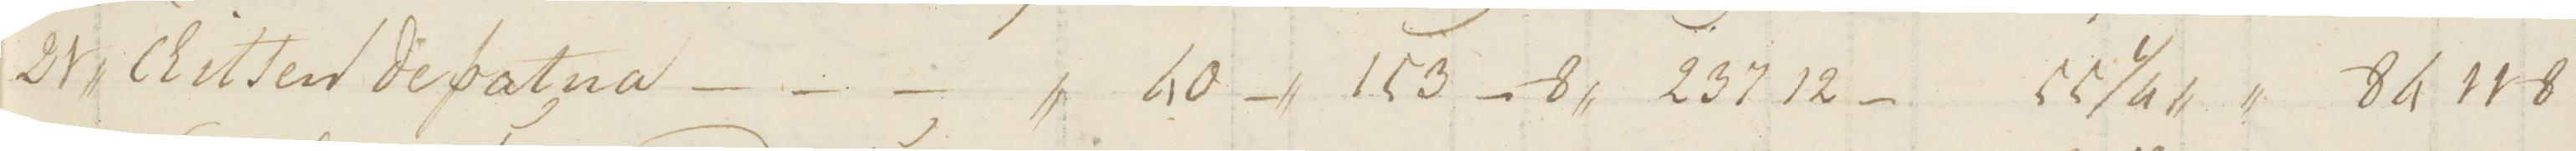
21 „ Chitsen depatna - - - „ 40 - „ 153 - 8„ 237 12 - 55¼ „ „ 84 11 8
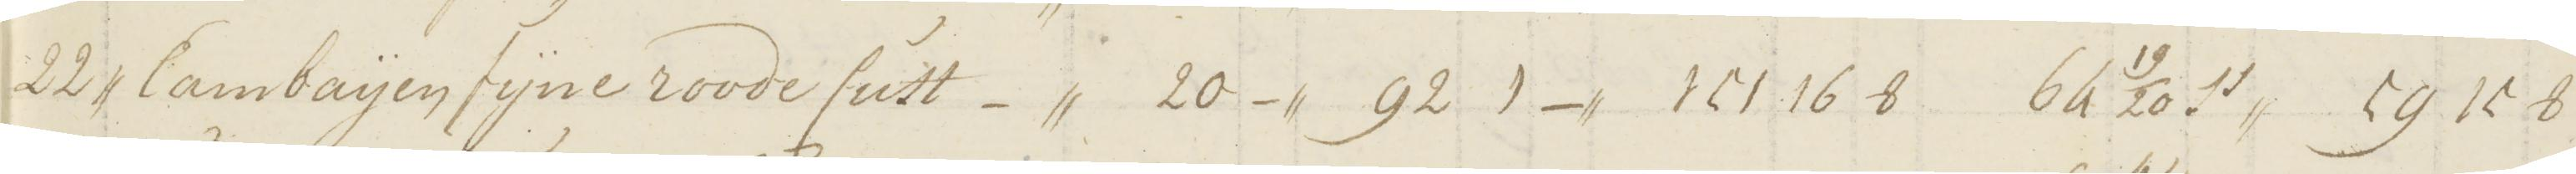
22 „ lambaijen fijne roode Cust - „ 20 - „ 92 1 - „ 151 16 8 64 19/20 ps „ 59 15 8
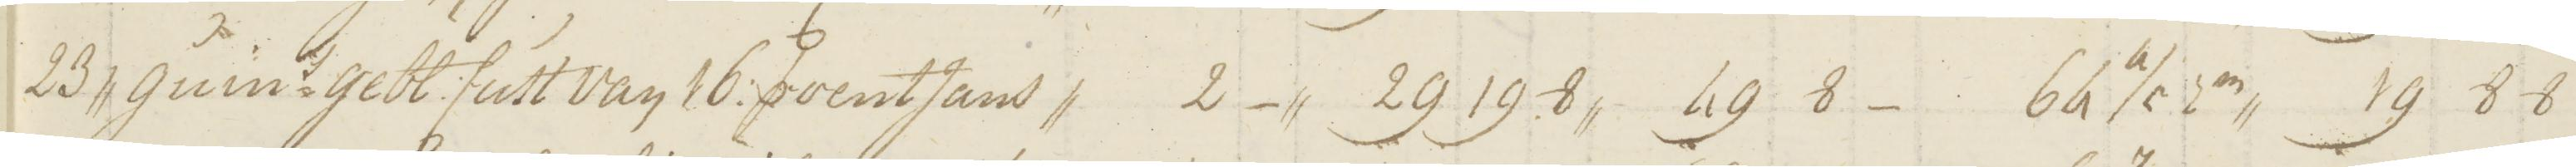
23 „ guin=s gebl: Cust van 16: poent Jans „ 2 - „ 29 198 „ 49 8 - 64 4/5 rm „ 19 8 8
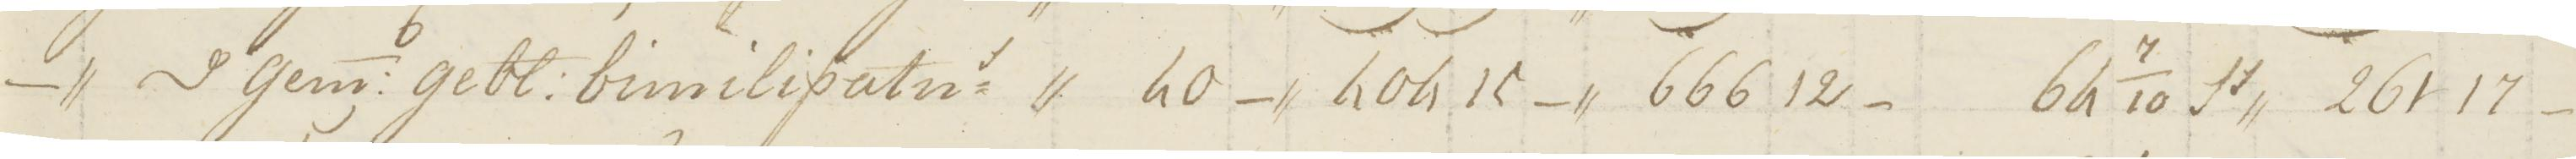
- „ do gem: gebl: bimilipatn=s „ 40 - „ 404 15 - „ 666 12 - 64 7/10 ps „ 261 17 -
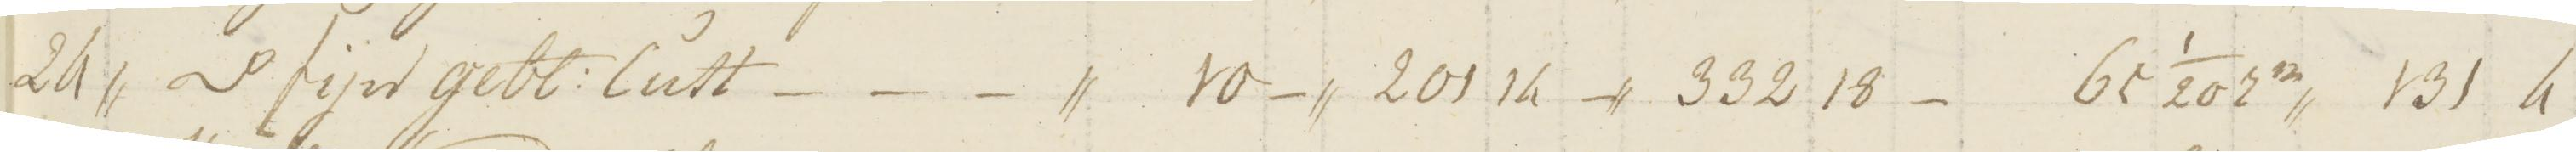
24 „ do sijn gebl: Cust - - - „ 10 - „ 201 14 - „ 332 18 - 65 1/20 rm „ 131 4
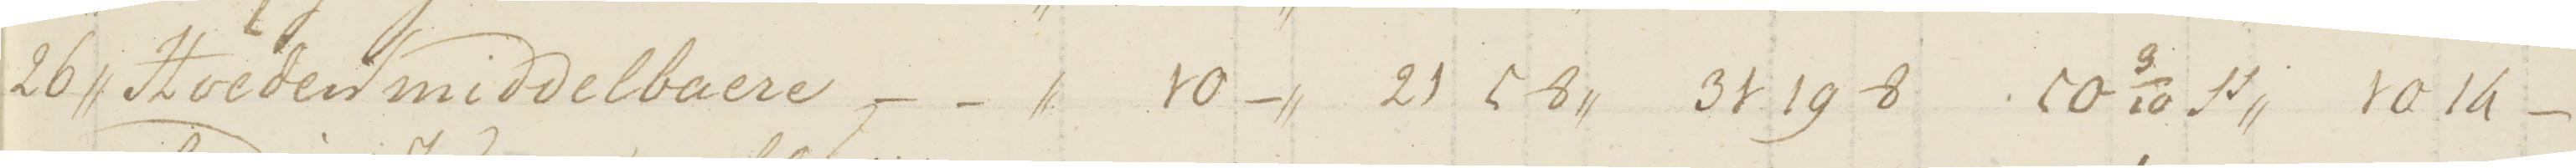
26 „ Hoeden middelbaere - - „ 10 - „ 21 5 8 „ 31 19 8 50 9/10 ps „ 10 14 -
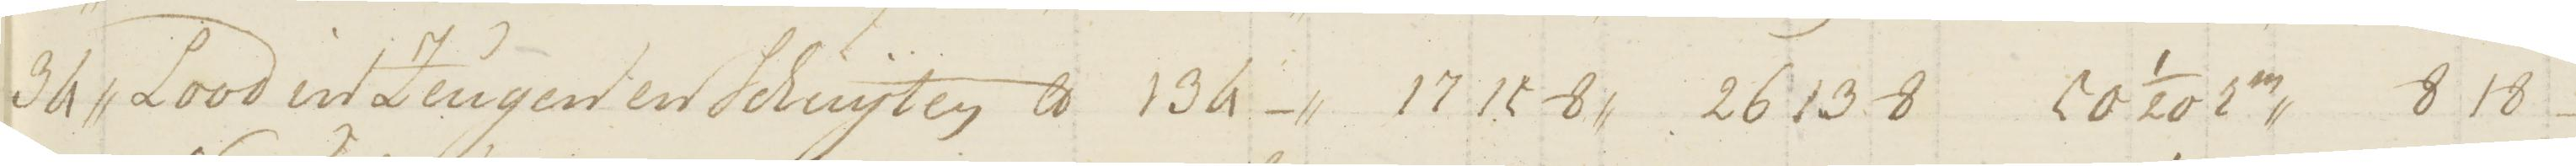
34 „ Lood in Zeugen en schuijten lb 134 - „ 17 15 8 „ 26 13 8 50 1/20 rm „ 8 18 -
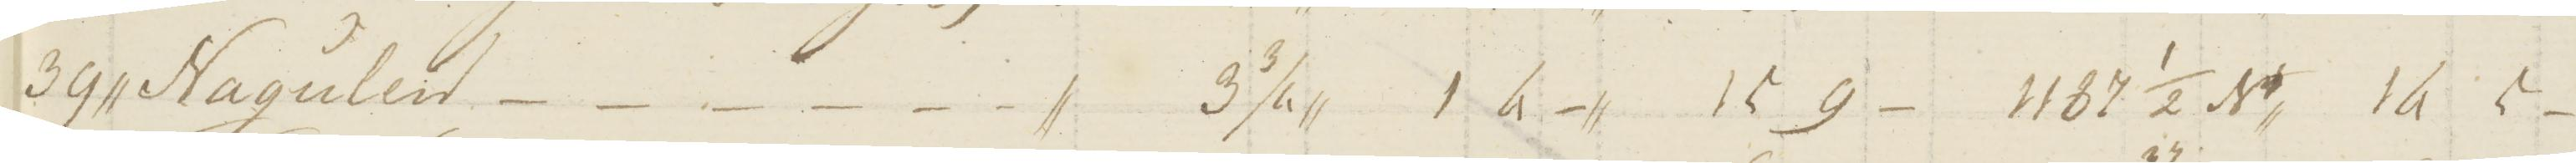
39 „ Nagulen - - - - - - „ 3¾ „ 1 4 - „ 15 9 - 1187½ N„t 14 5 -
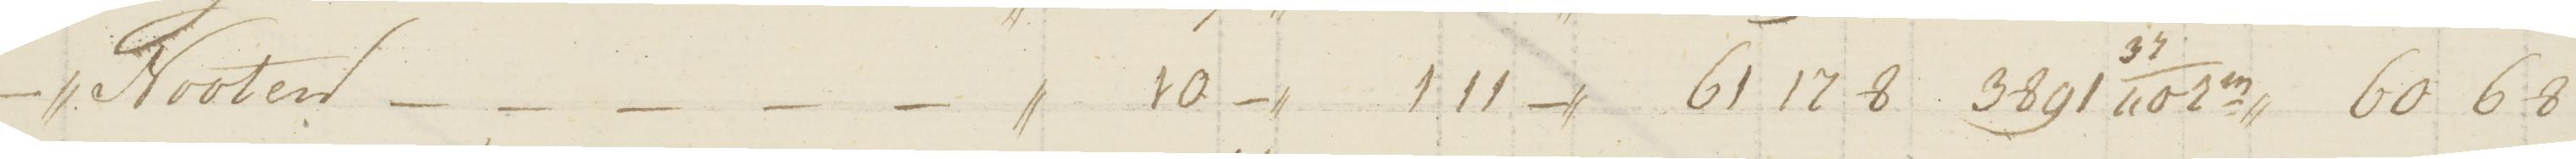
- „ Nooten - - - - - „ 10 - „ 1: 11 -„ 61 17 8 3891 37/40 r=m „ 60 6 8
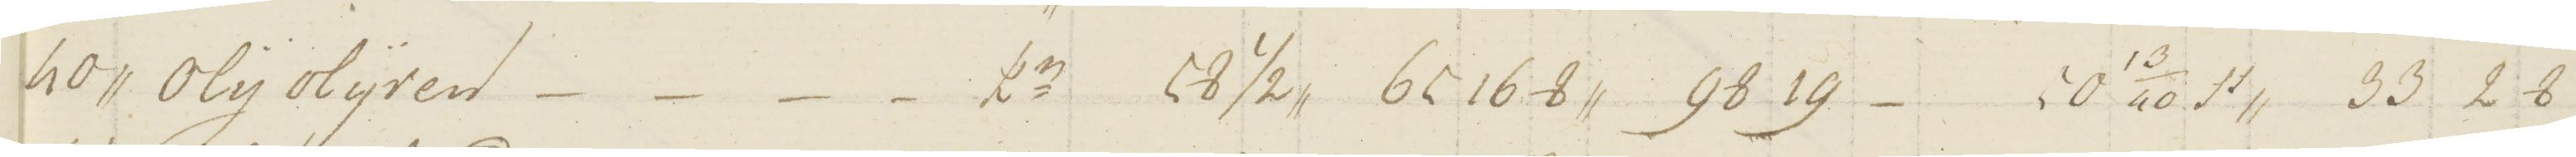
40 „ olij olijven - - - - p=r 58½ 65 16 8 „ 98 19 - 50 13/40 p„ 33 2 8
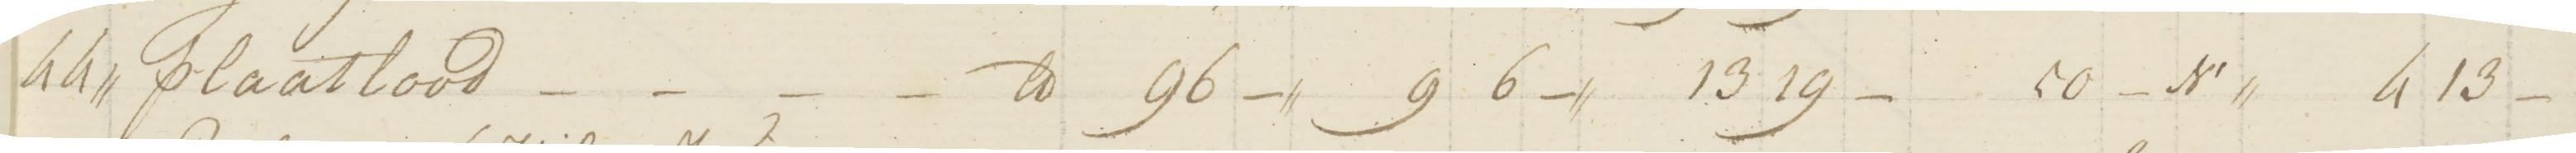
44 „ plaatlood - - - - lb 96 - „ 9 6 - „ 13 19 - 50 N„ 4 13 -
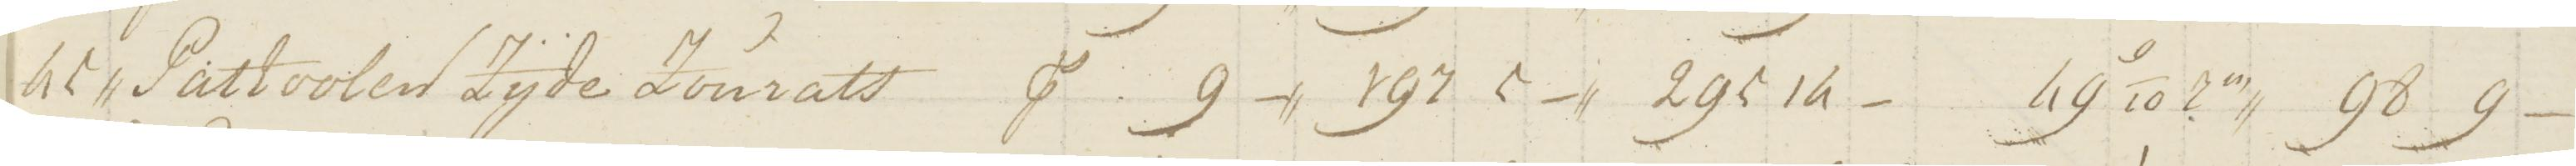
45 „ Pathoolen zijde Zourats p:s 9 - „ 197 5 - „ 295 14 - 49 9/20 rm „ 98 9 -
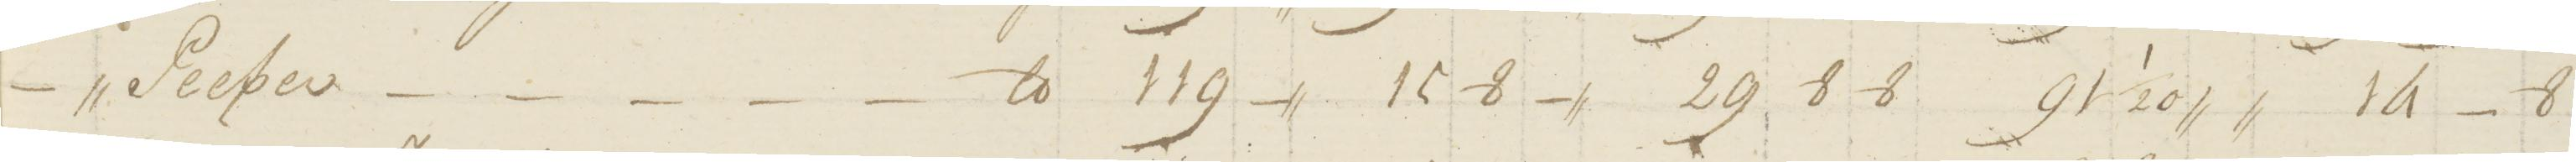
- „ Peeper - - - - - lb 119 - „ 15 8 - „ 29 8 8 91 1/20 „ „ 14 - 8.
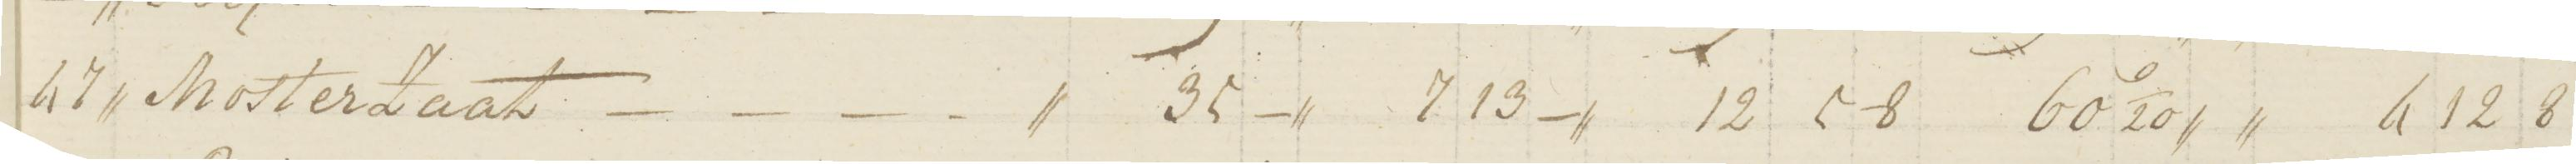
47„ Mosterzaat - - - - „ 35 - „ 7 13 - „ 12 5 8 60 9/20 „ „ 4 12 8
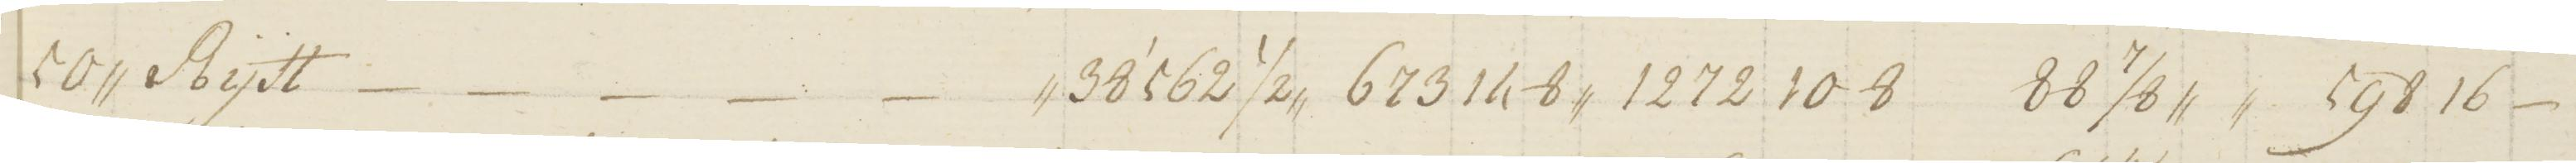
50 „ Rijst - - - - - „ 38'562½ „ 673 14 8 „ 1272 10 8 88 7/8 „ „ 598 16 -
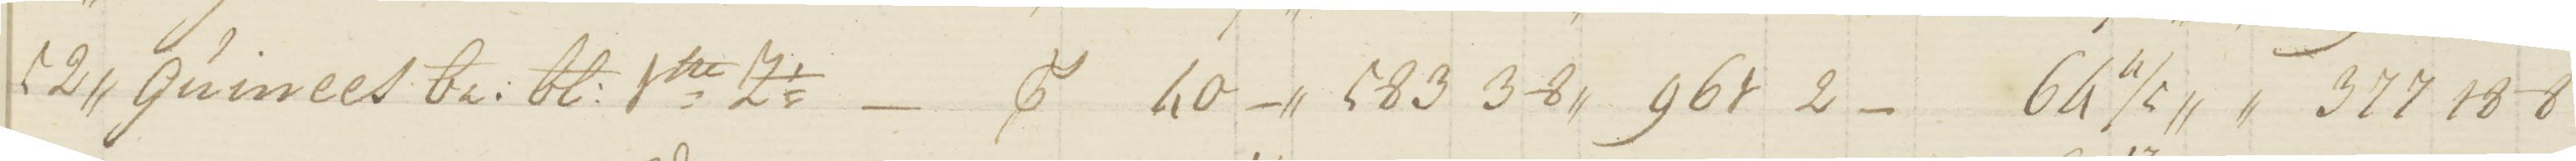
52 „ Guinees br: lb: 1=ste z=t .. ps 40 - „ 583 38 „ 961 2 - 64 4/5 „ „ 377 18 8
